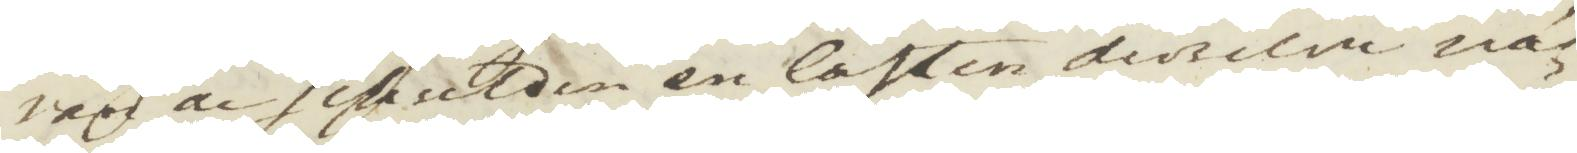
van de schulden en lasten deszelve na„
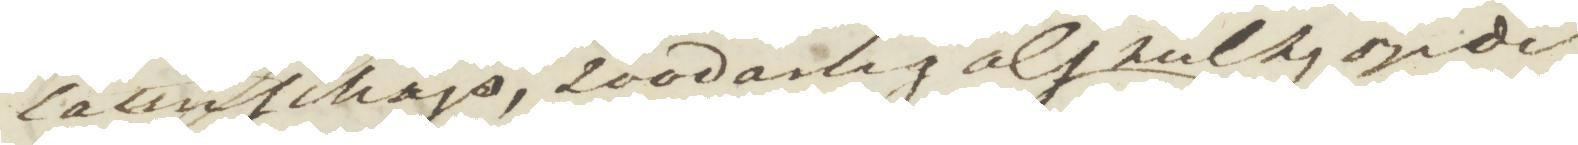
latenschap, zoodanig als zulks op de
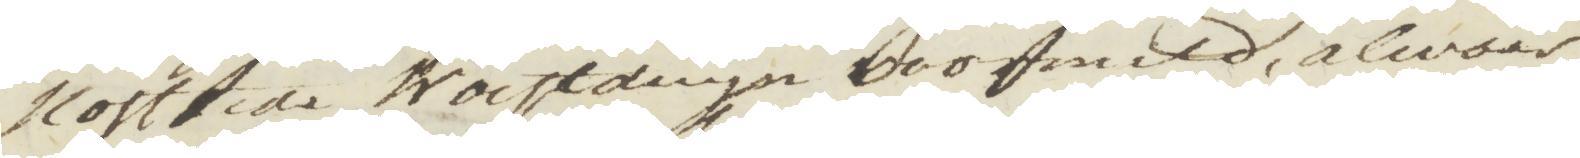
Hofstede Woestduyn voormeld, alwaar
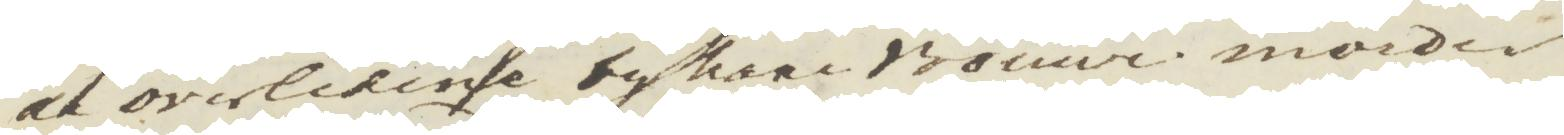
de overledene by hare Vrouwe moeder
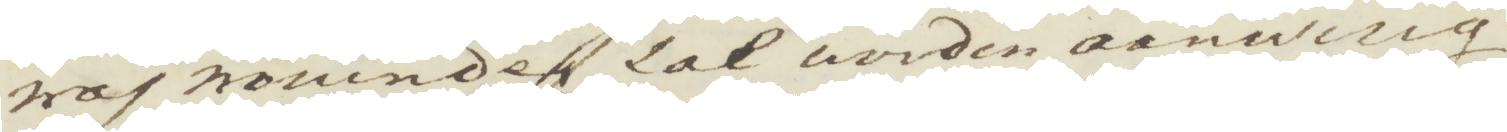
was wonende, zal worden aanwezig
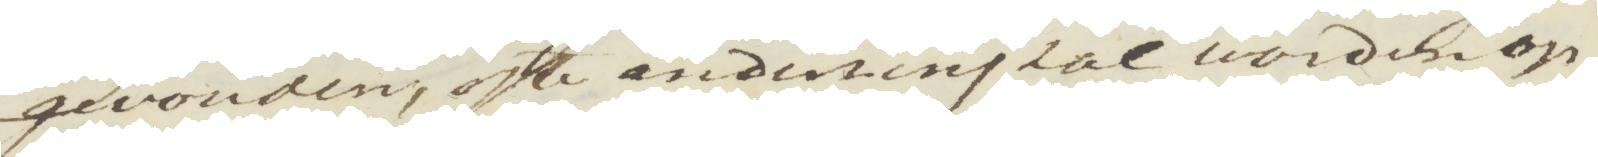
gevonden, ofte anderzins zal worden op
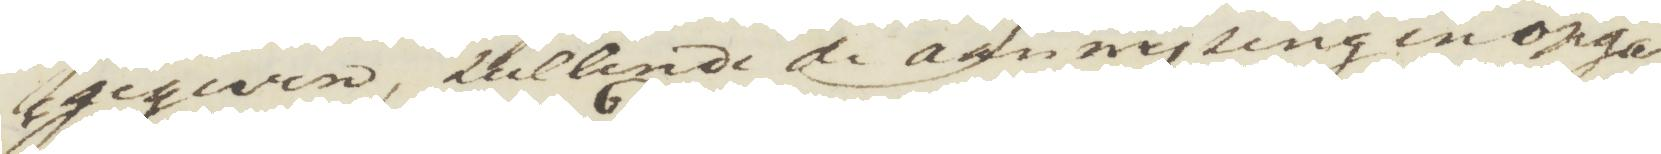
gegeven, zullende de aanwyzing en opga
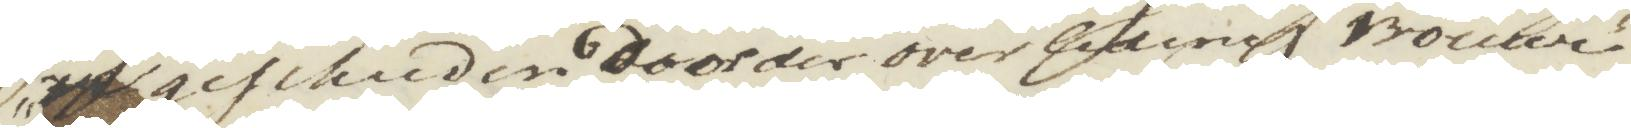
„ve geschieden door der overleden Vrouwe
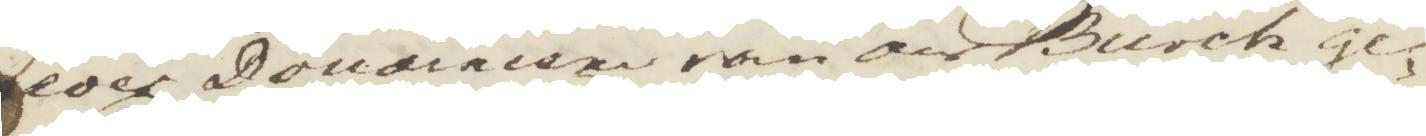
moeder Douarriere van der Burch ge„
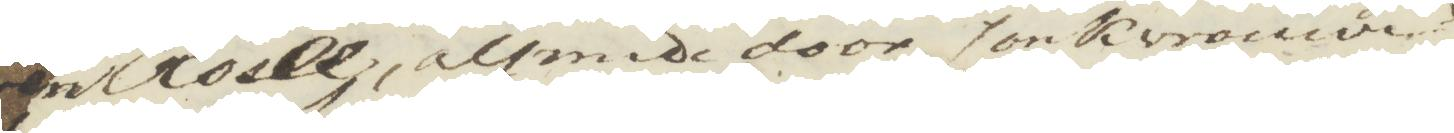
„boren Roell, alsmede door Jonkvrouwe
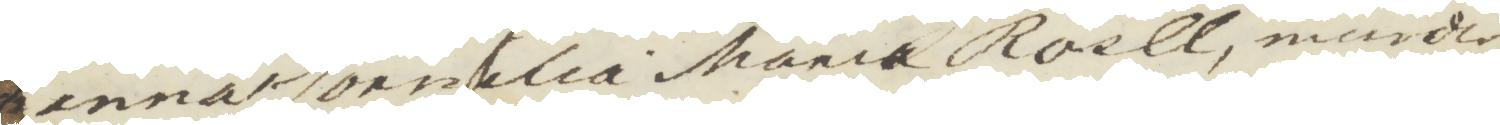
Johanna Cornelia Maria Roell, minder
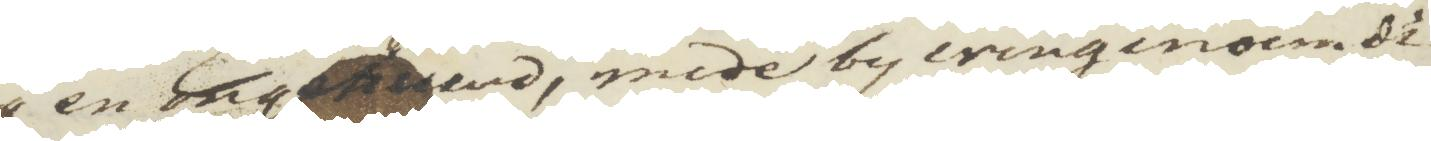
jarig en ongehuwd, mede by evengenoemde
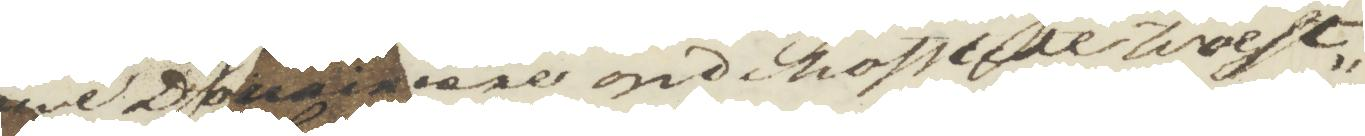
Vrouwe Douarriere op de hofstede Woest„
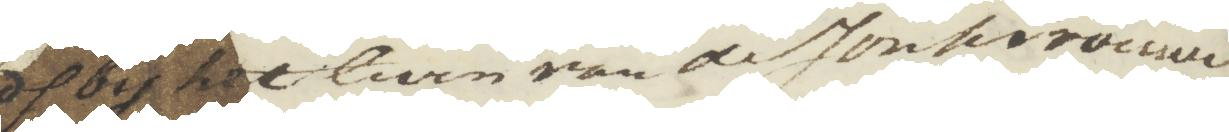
„duyn reeds by het leven van de Jonkvrouwe
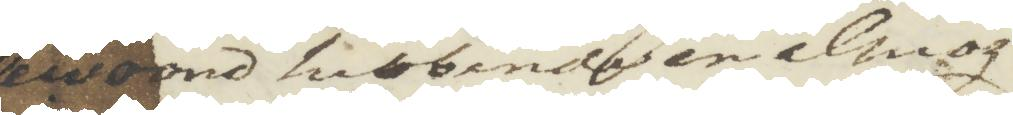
overleden gewoond hebbende en nog
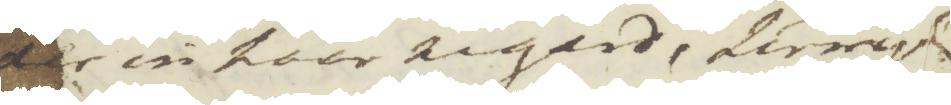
woonachtig, ieder in in haar regard, terwyl
